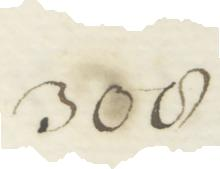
308
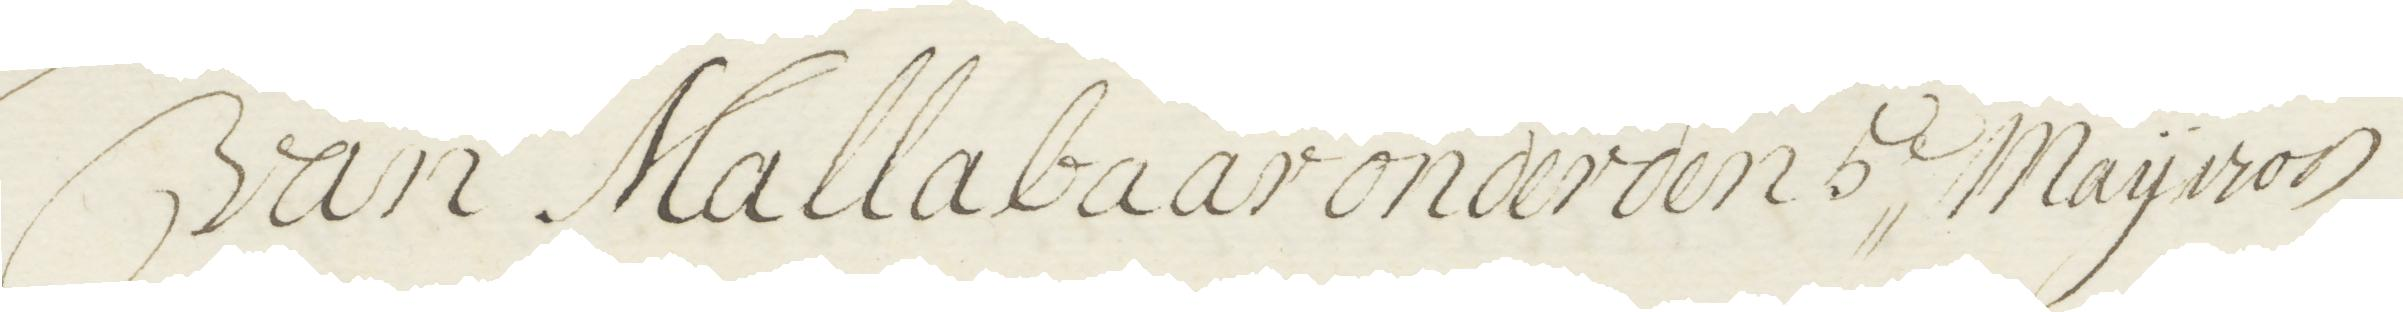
Van Mallabaar onder den 5„e Maij 1708
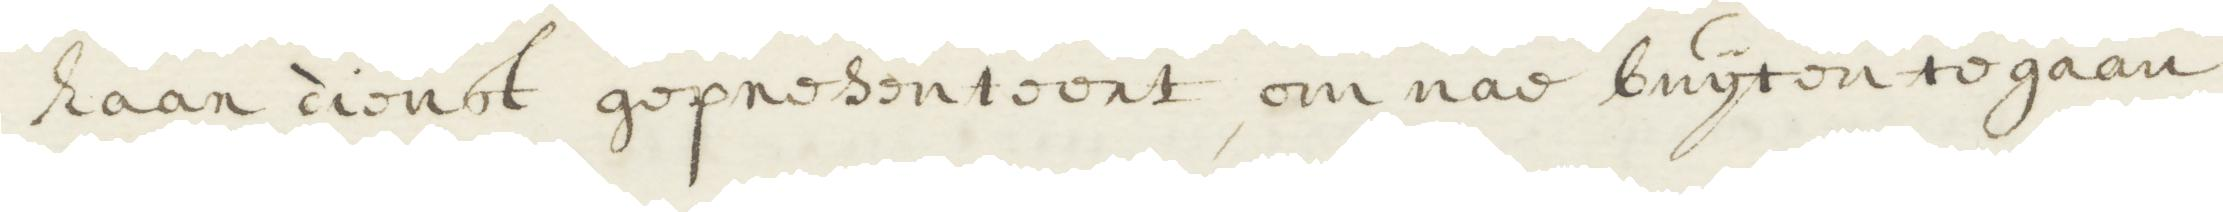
haar dienst gepresenteert om nae buijten te gaan
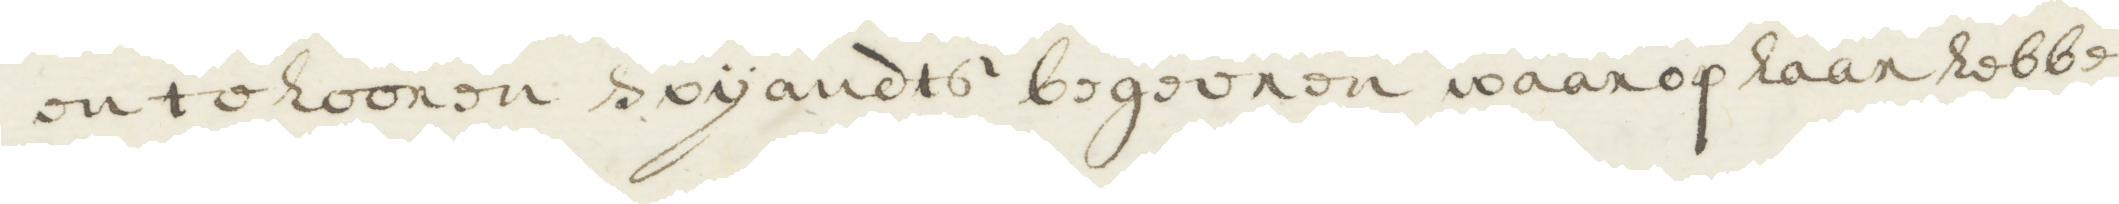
en tehooren s vijandts begeeren waarop haar hebbe
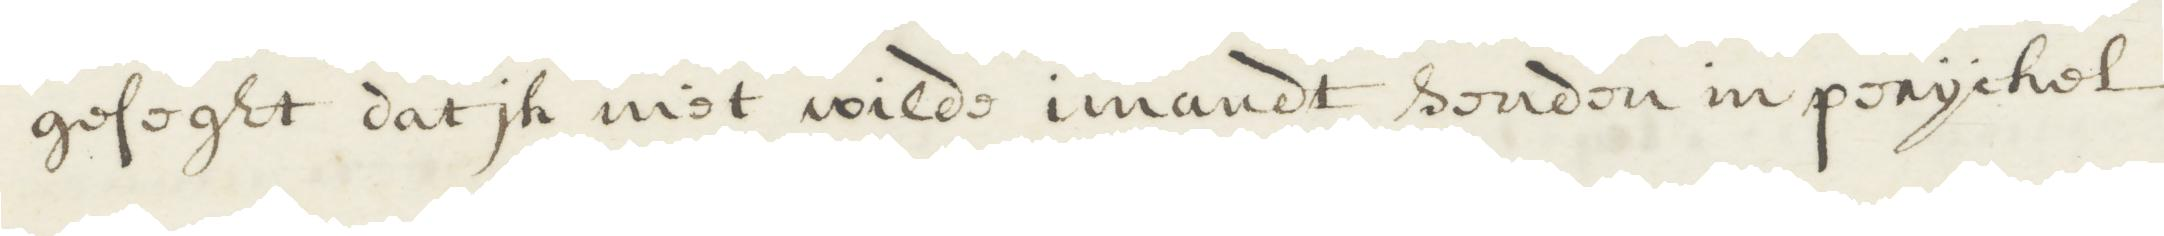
geseght dat jk niet wilde imandt senden in perijckel
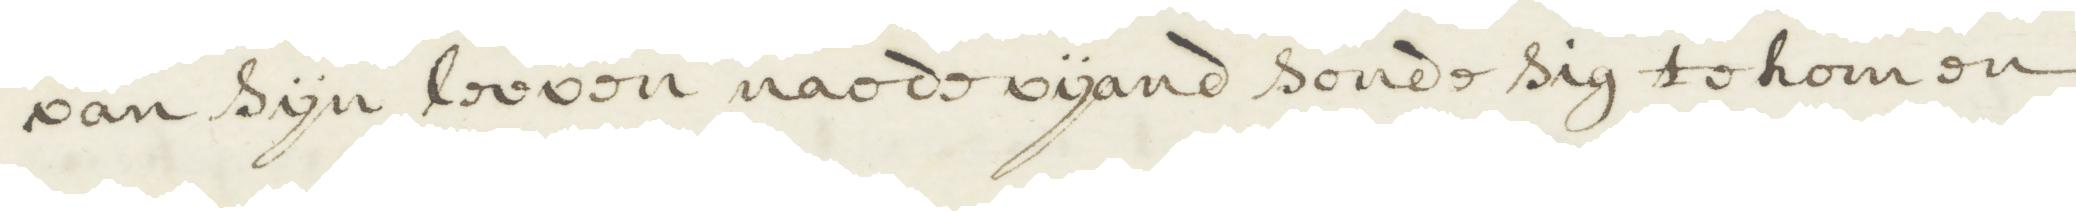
van zijn leeven nae de vijand soude sig te komen
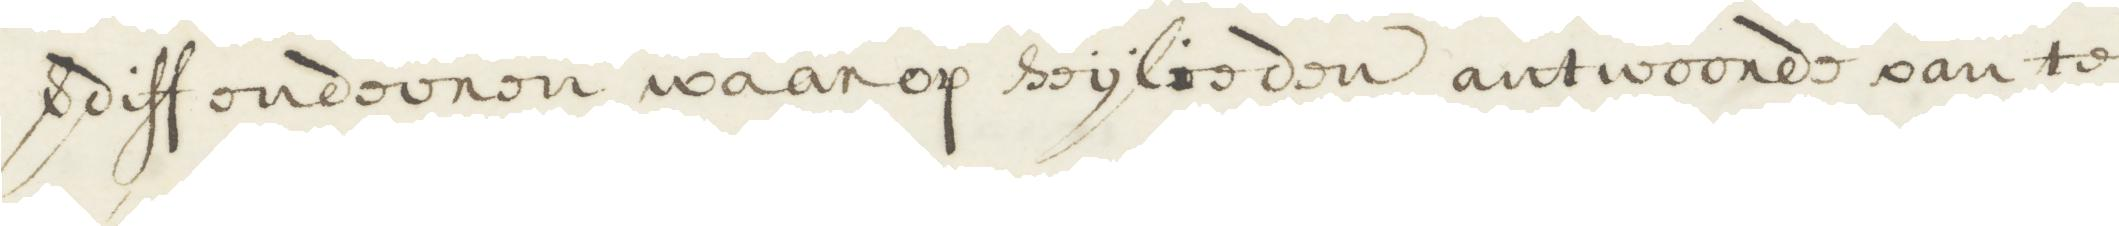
verdiffendeeren, waarop seijlieden antwoorde van te
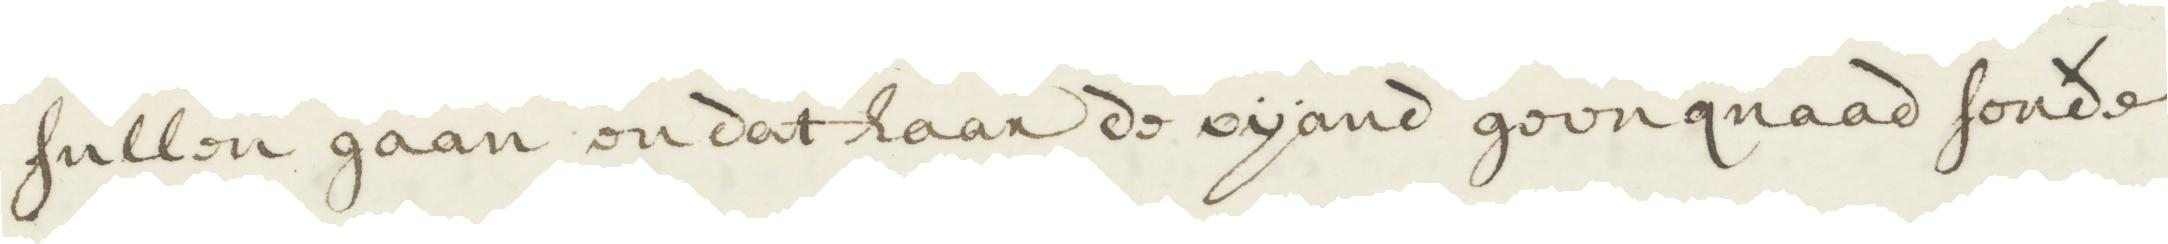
sullen gaan en dat haar de vijand geen quaad soude
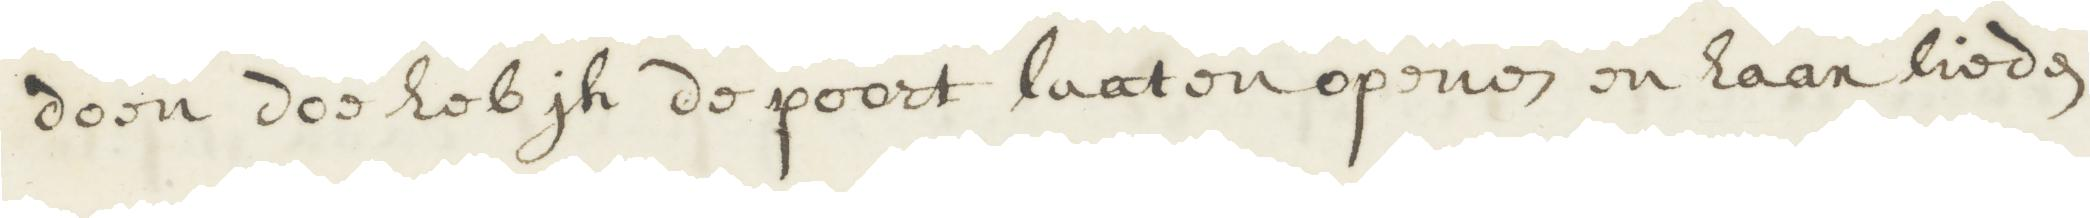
doen doe heb jk de poort laaten openen en haar lieden
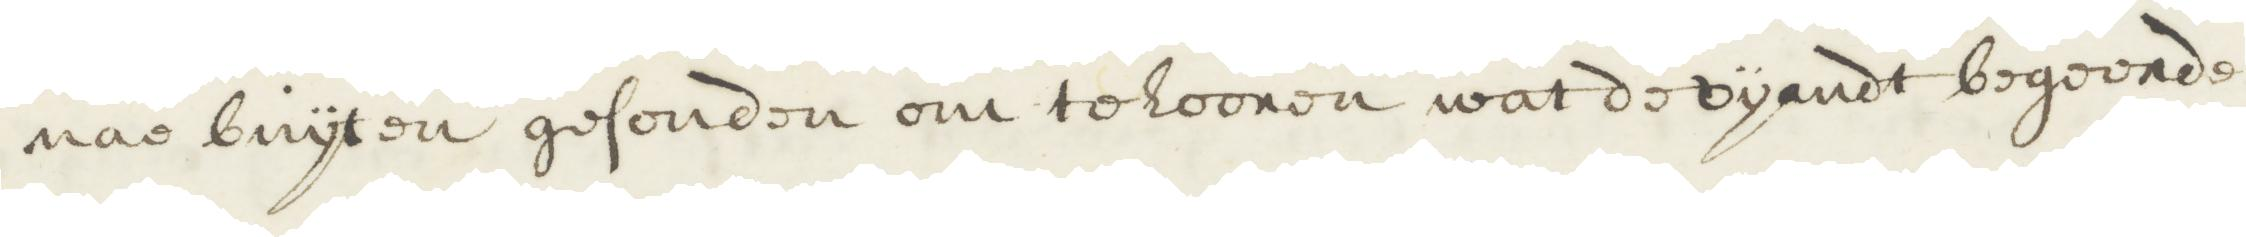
nae buijten gesonden om te hooren wat de vijandt begeerde
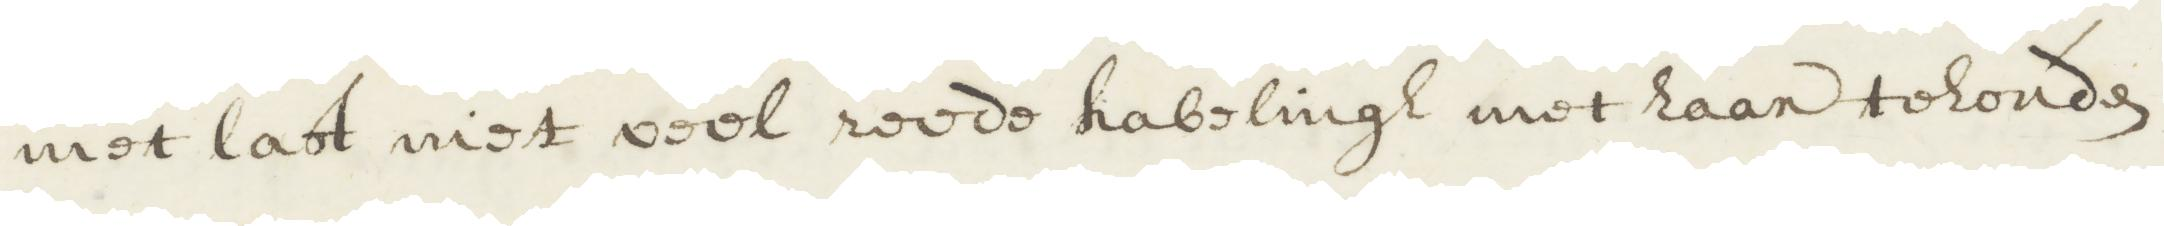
met last niet veel reede kabelingh met haar tehouden
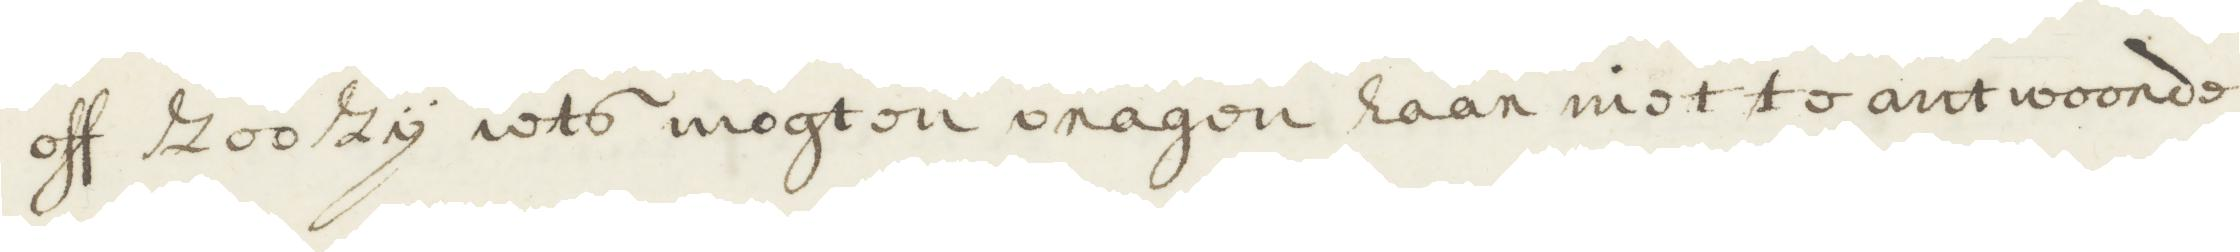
off zoo zij iets mogten vragen haar niet te antwoorde
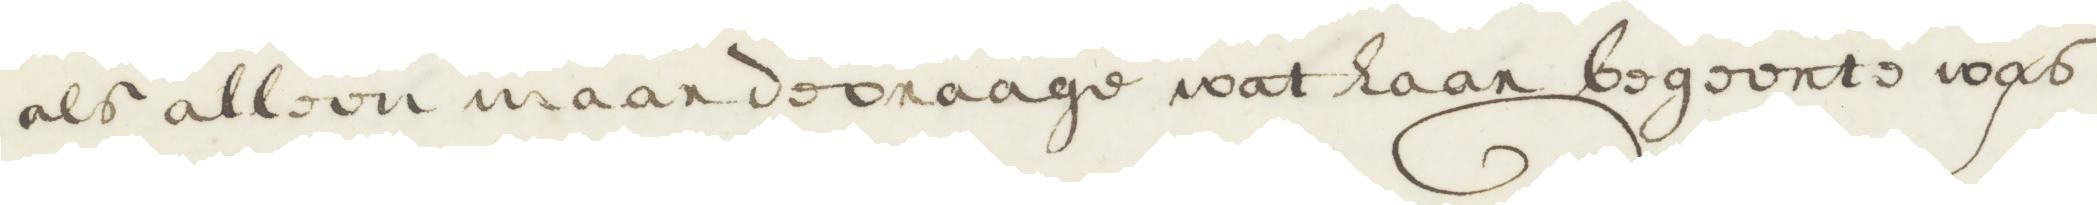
als alleen maar devraage wat haar begeerte was
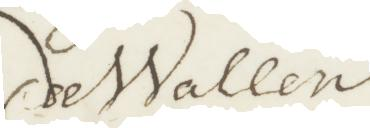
de Wallen
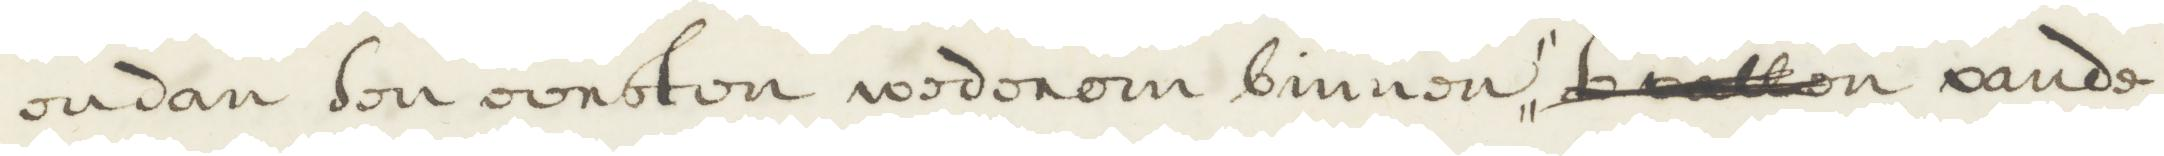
en dan ten eersten wederom binnen „ te vallen vande
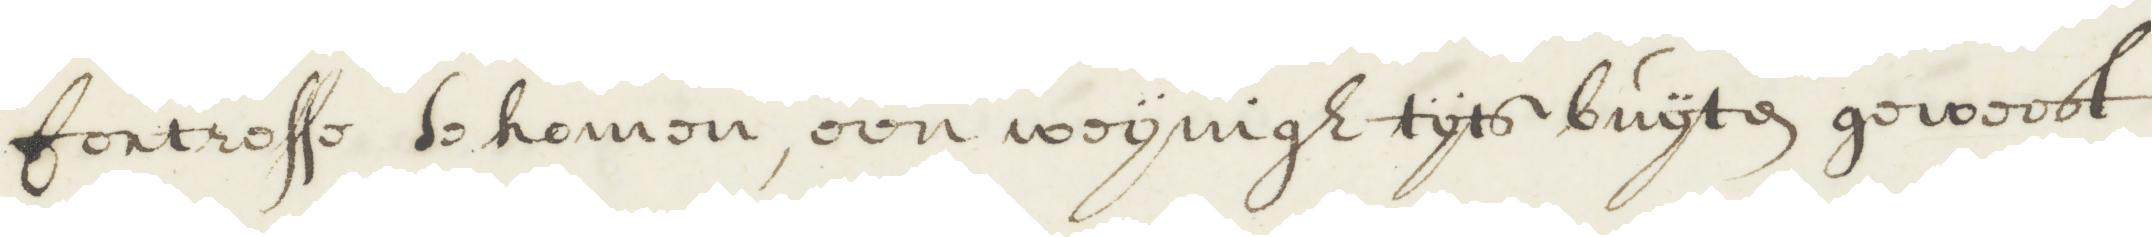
fortresse te komen, een weijnigh tijts buijten geweest
